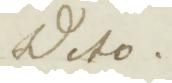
Dito. . . . . . . .
